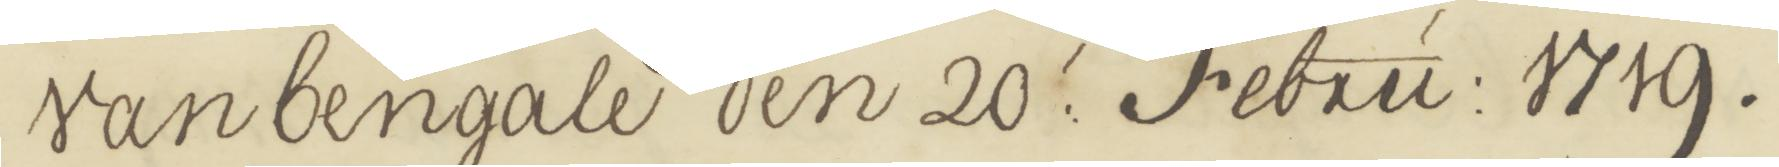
van bengale den 20:' Febru: 1719.
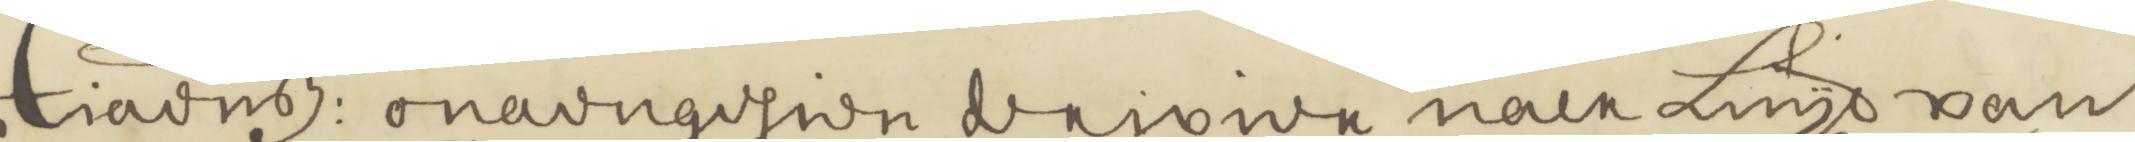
'tiaensz: onaengesien de rivier naer Luijd van
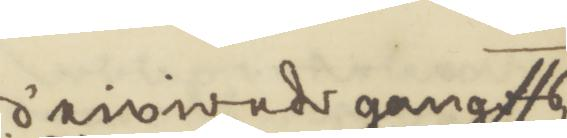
d’rivierde ganges
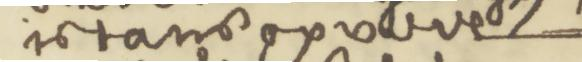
is tans op veel
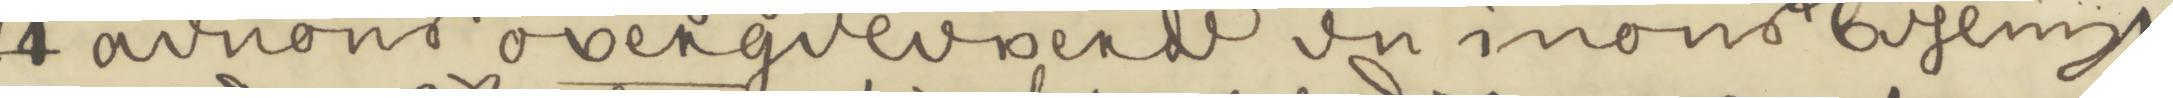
’t aen ons overgeleverde en in ons besluijt
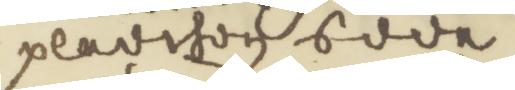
plaetsen seer
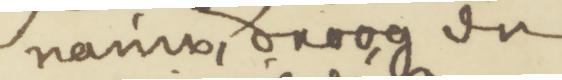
nauw, droog en
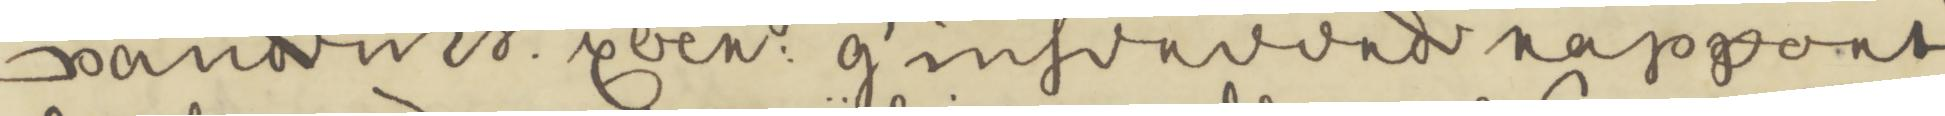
van den 28. xber: g'insereerde rapport
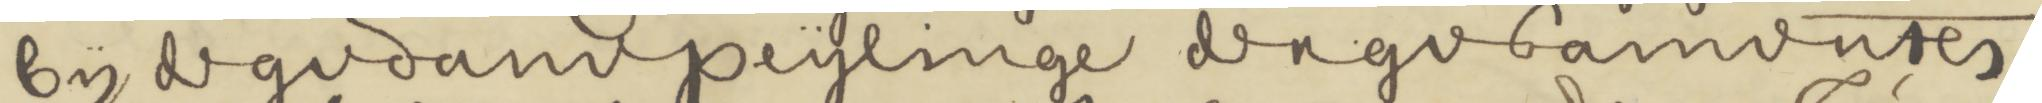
bij de gedane veijlinge der gesamentlijk
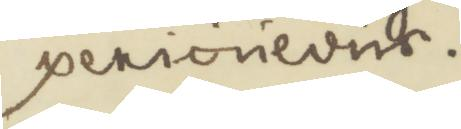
periculeur.
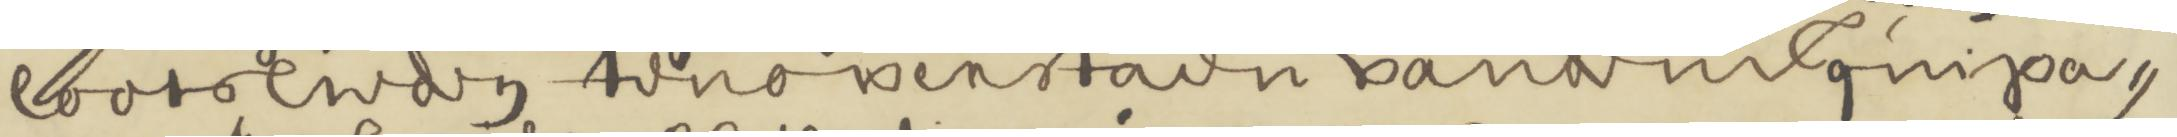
lootslieden ten overstaen van den Equipa„
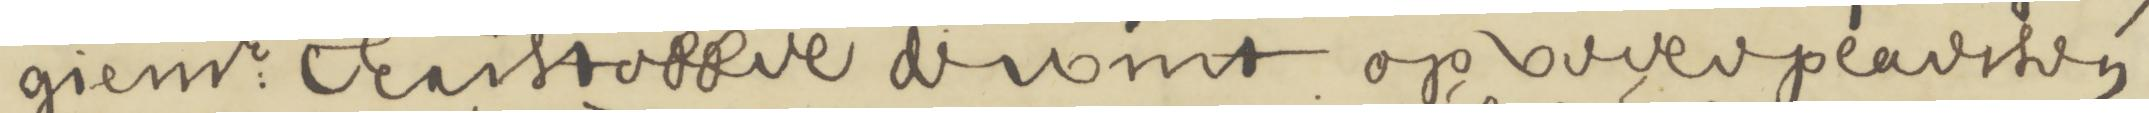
giem:r christoffel de wint op veele plaetsen
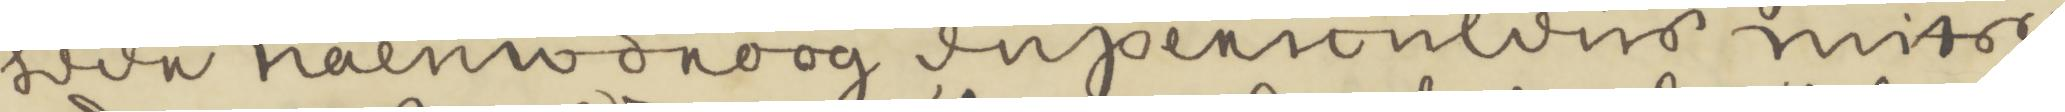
seer naeuwdroog en periculeus mits„
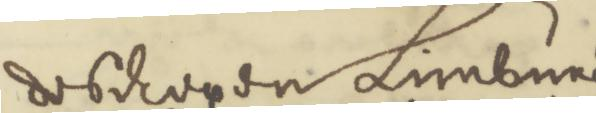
de schepen Limburg
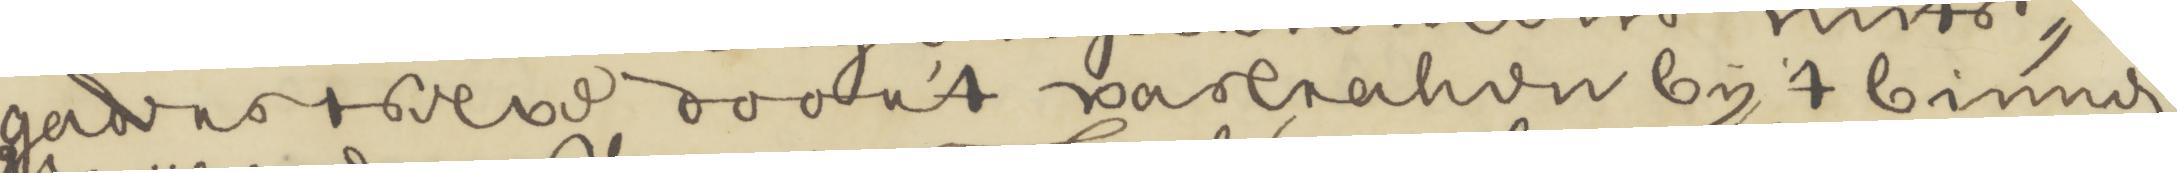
gaders tselve door’t vastraken bij ’t binnen
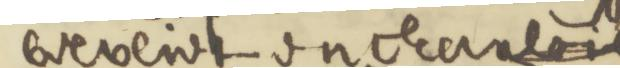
belvliet en charlois
